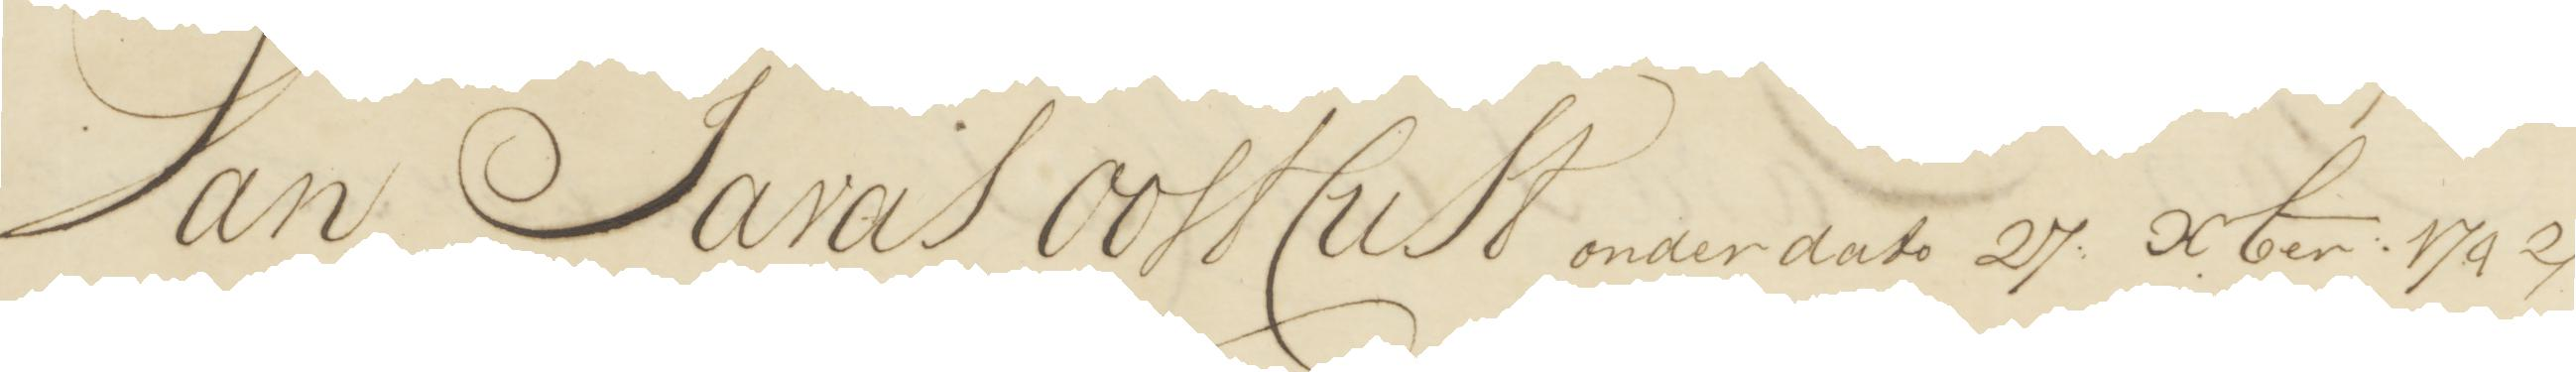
Van Iavas oost Cust onder dato 27: xber: 1742
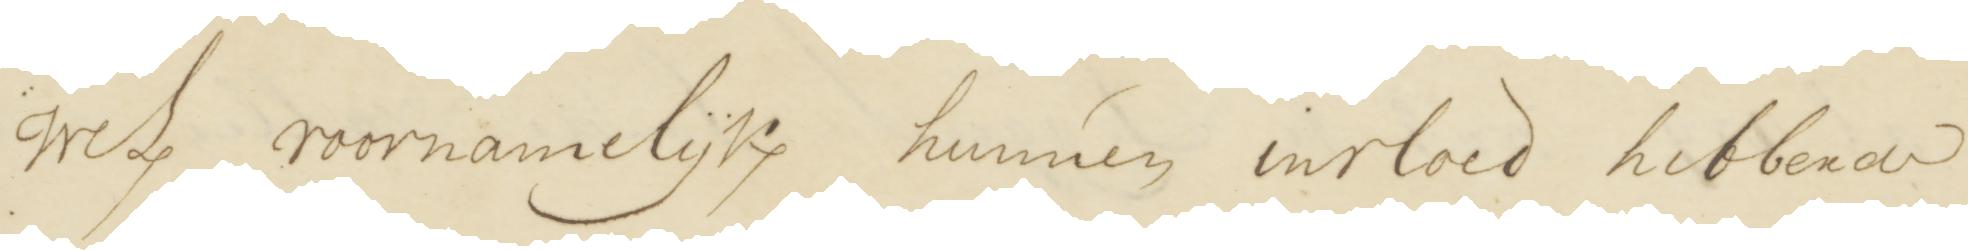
wel voornamelijk hunnen invloed hebbende
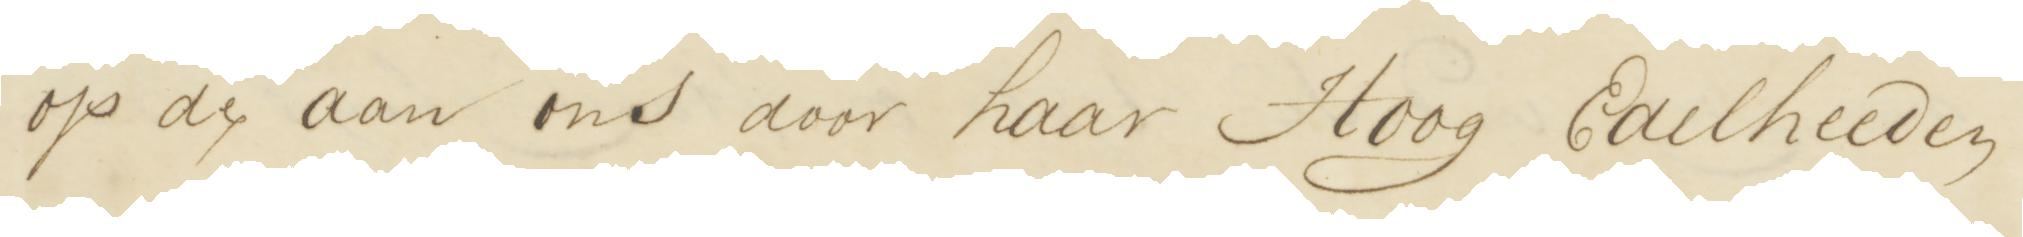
op de aan ons door haar Hoog Edelheeden
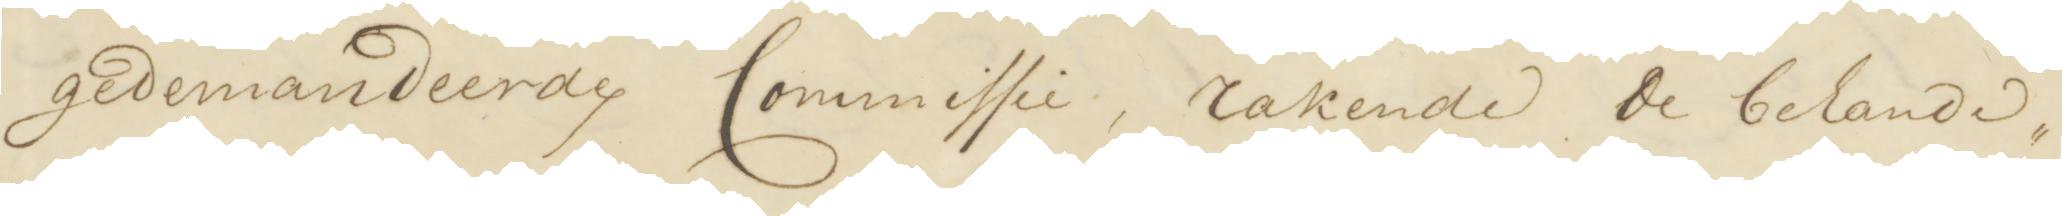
gedemandeerde Commissie, rakende de behande„
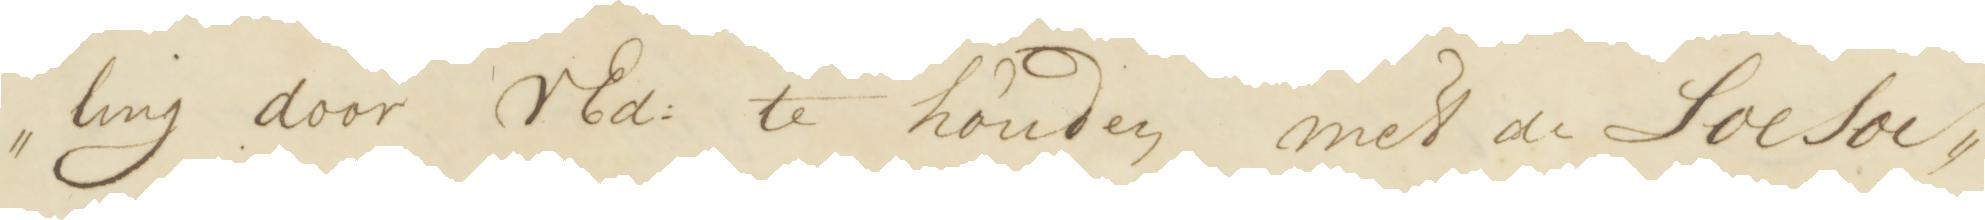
„ling door VEd: te houden met de soesoe„
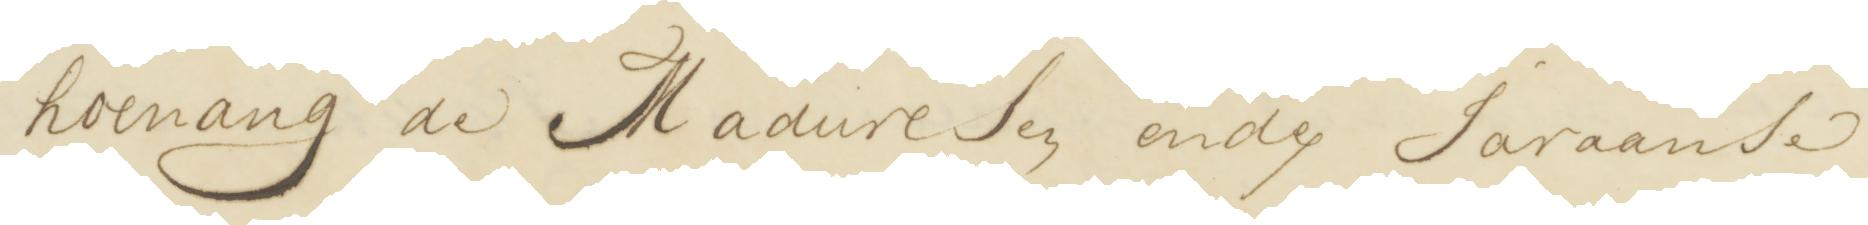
hoenang de Maduresen ende Iavaanse
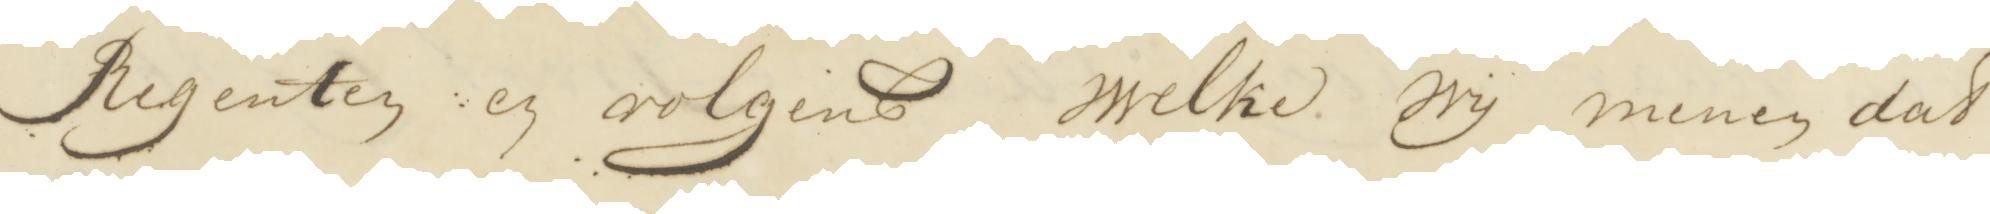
Regenten: en volgens welke wij menen dat
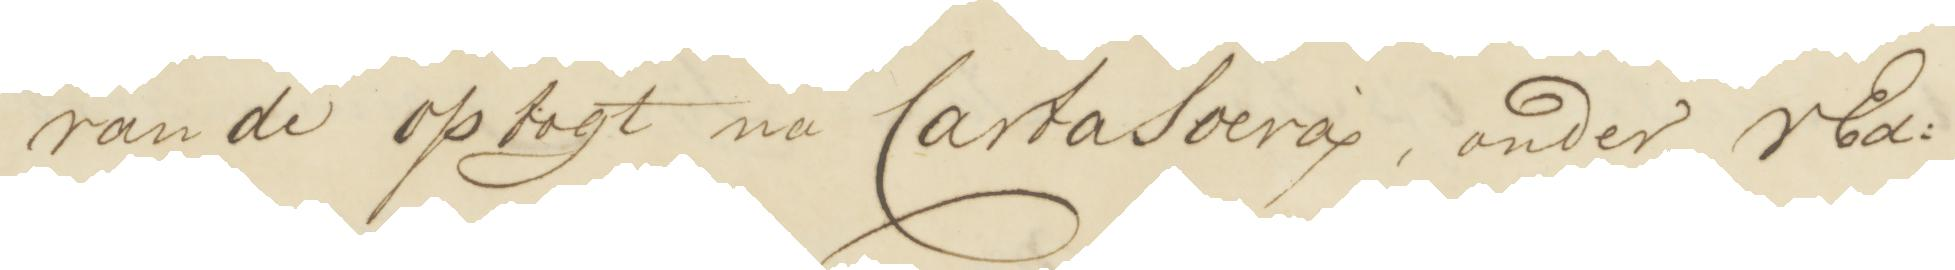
van de optogt na Cartasoera, onder VEd:
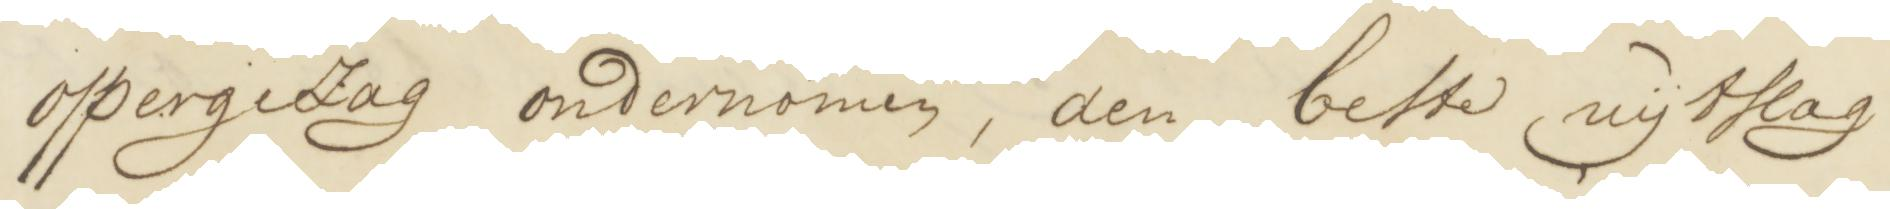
oppergezag ondernomen, den beste uijtslag
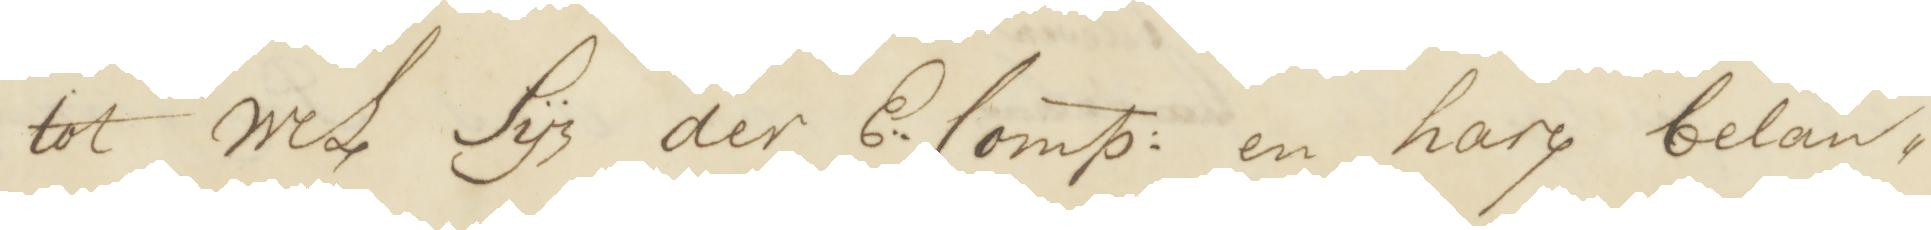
tot wel sijn der E: Comp: en hare belan„
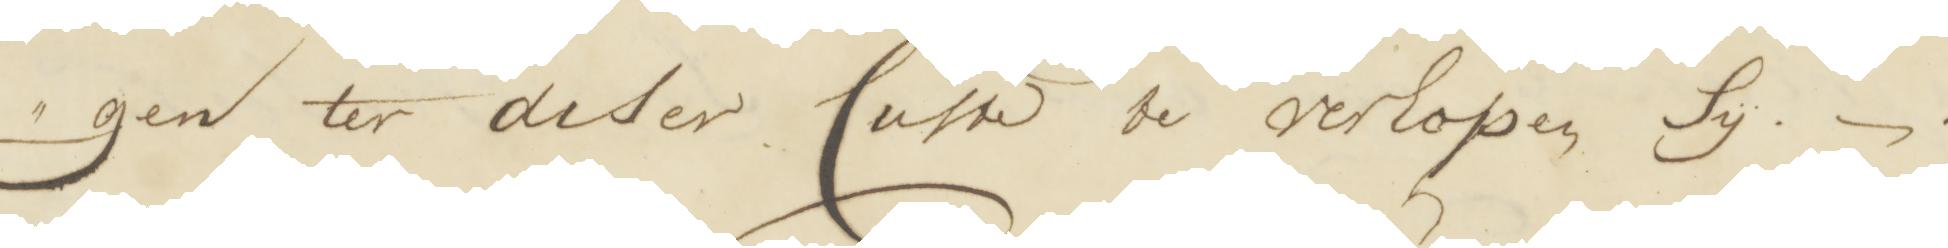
„gen ter deser Custe te verhopen sij. —
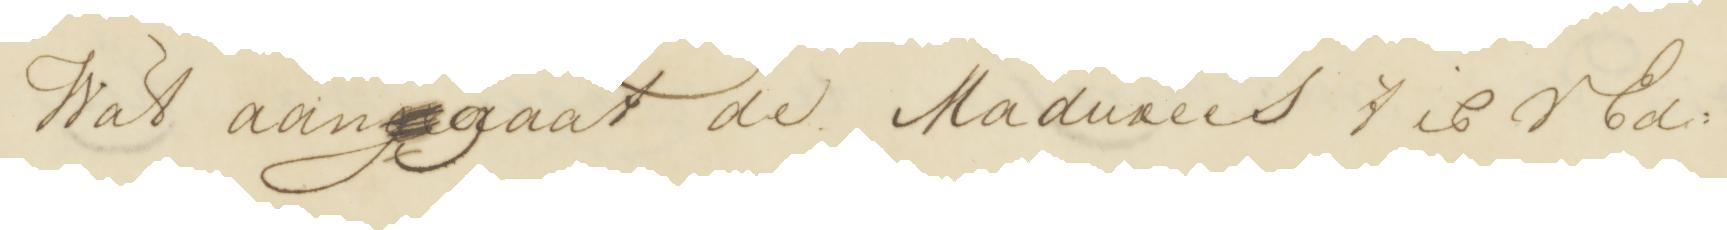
Wat aangegaat de Madurees 't is VEd:
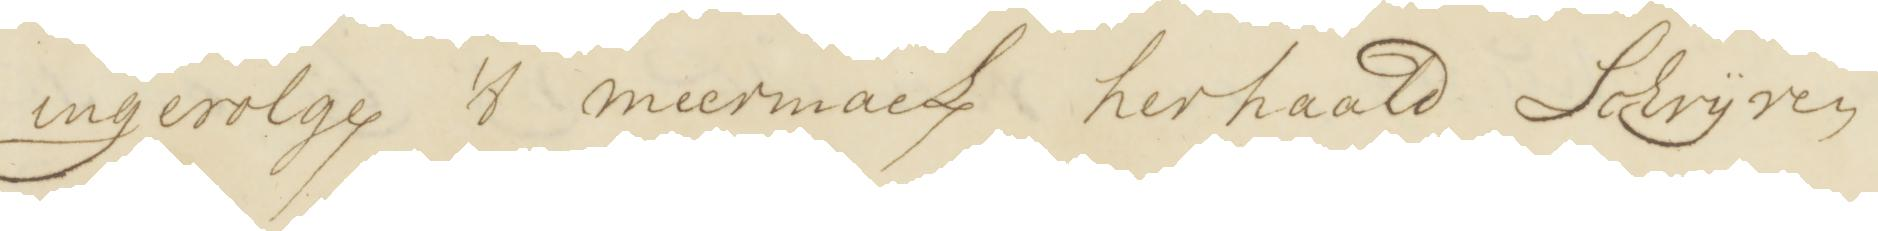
ingevolgen 't meermael herhaald schrijven
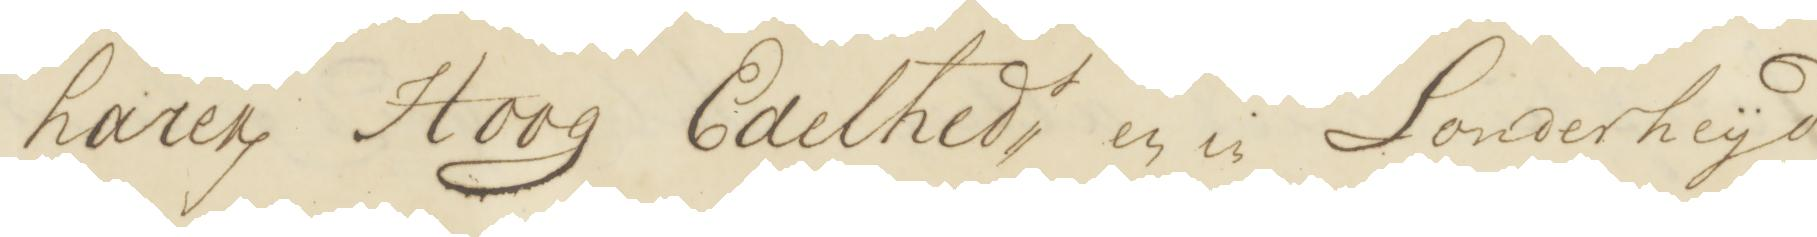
harer Hoog Edelhed„s en in sonderheijd
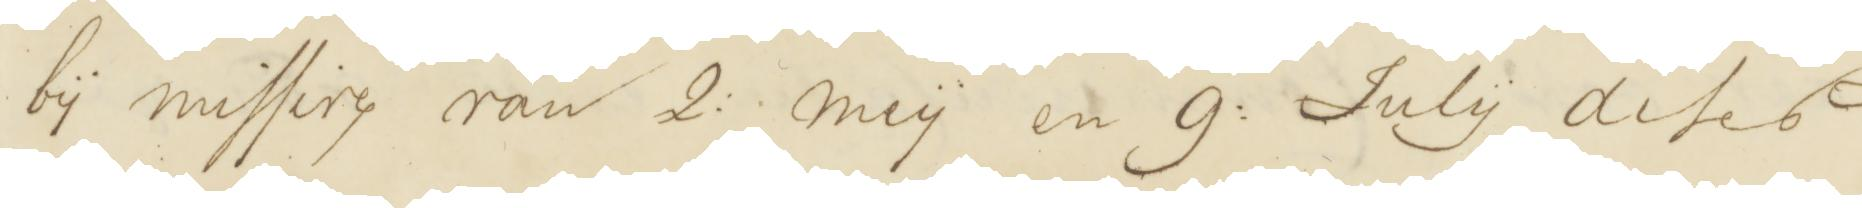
bij missive van 2: meij en 9: Iulij deses
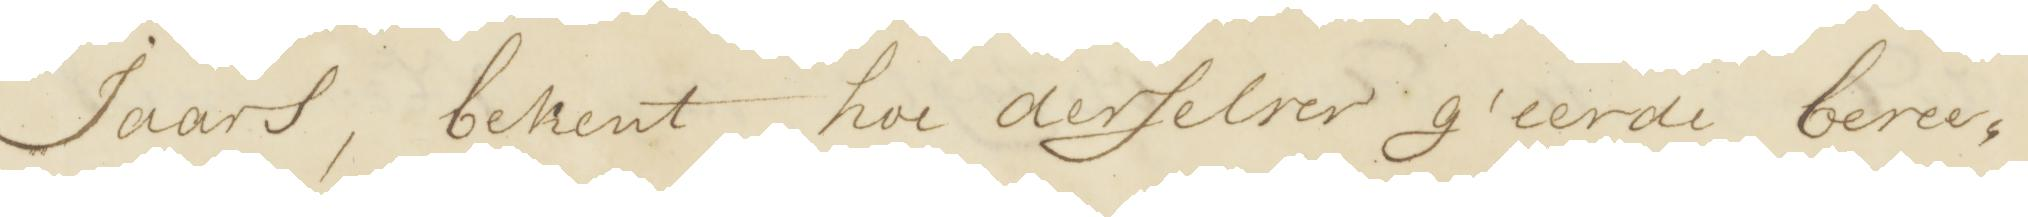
Iaars, bekent hoe derselver g’eerde bevee„
